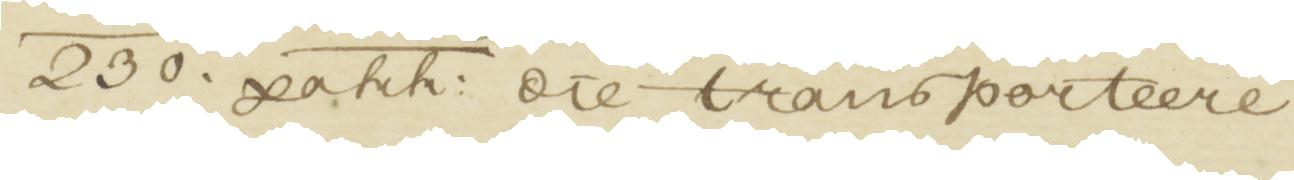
230. pakk: die transporteere
